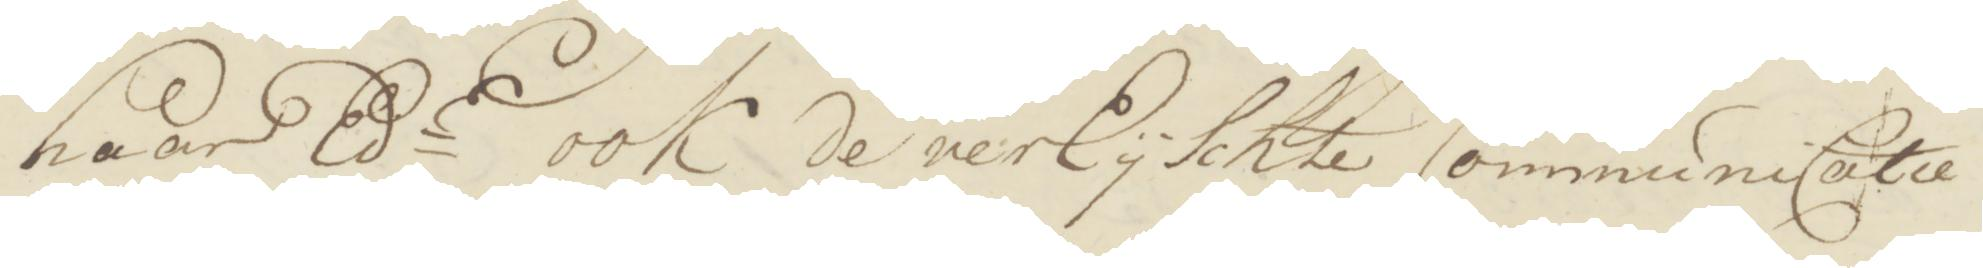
haar Ed=e ook de verEijschte Communicatie
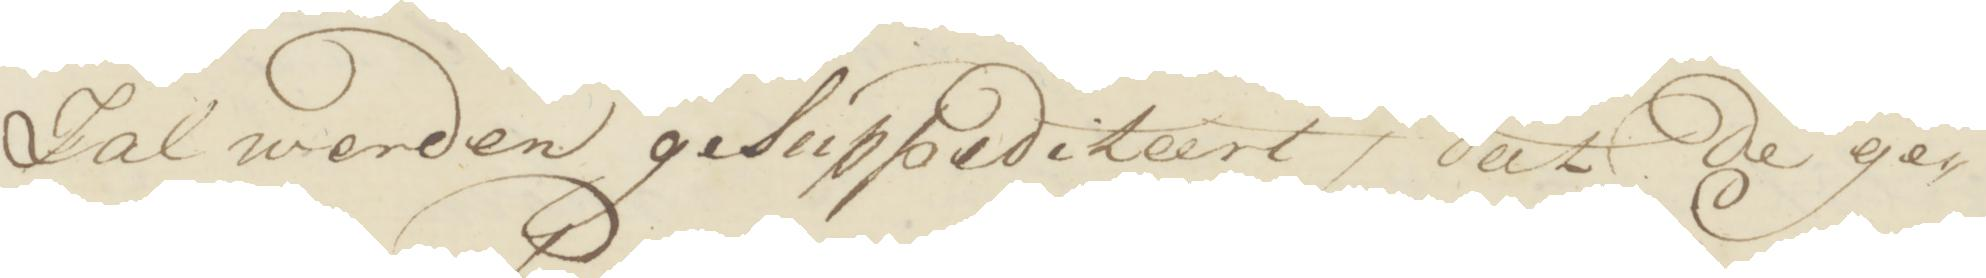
zal werden gesuppediteert, dat de ge„
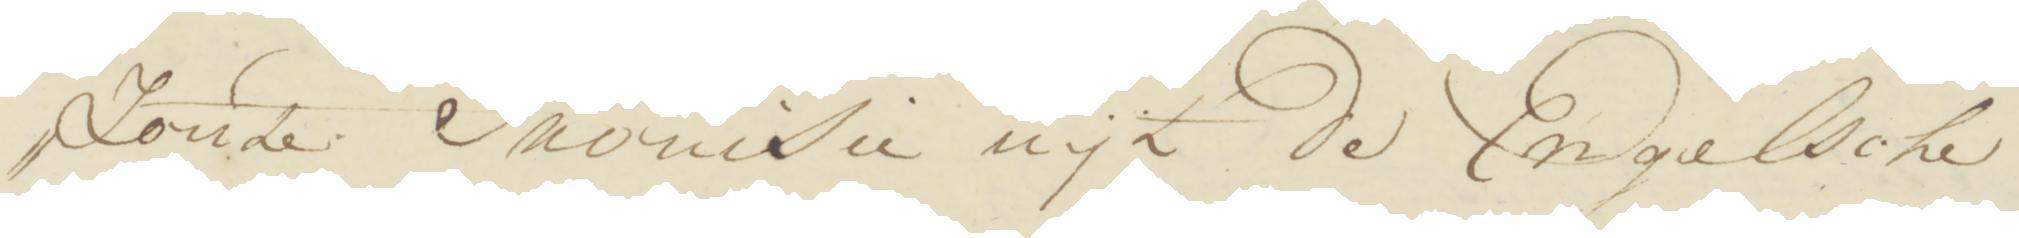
zonde Provisie uijt de Engelsche
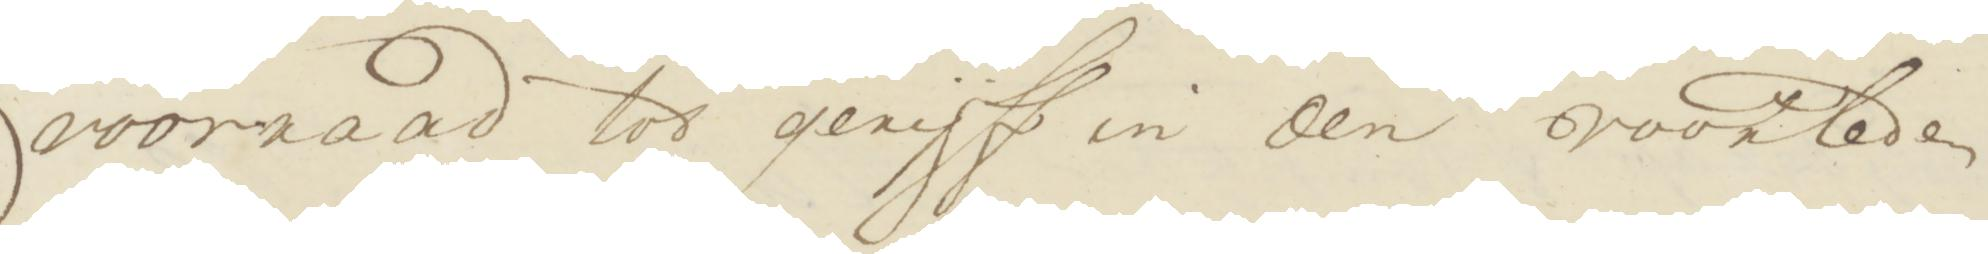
voorraad tot gerijff in den voorleden
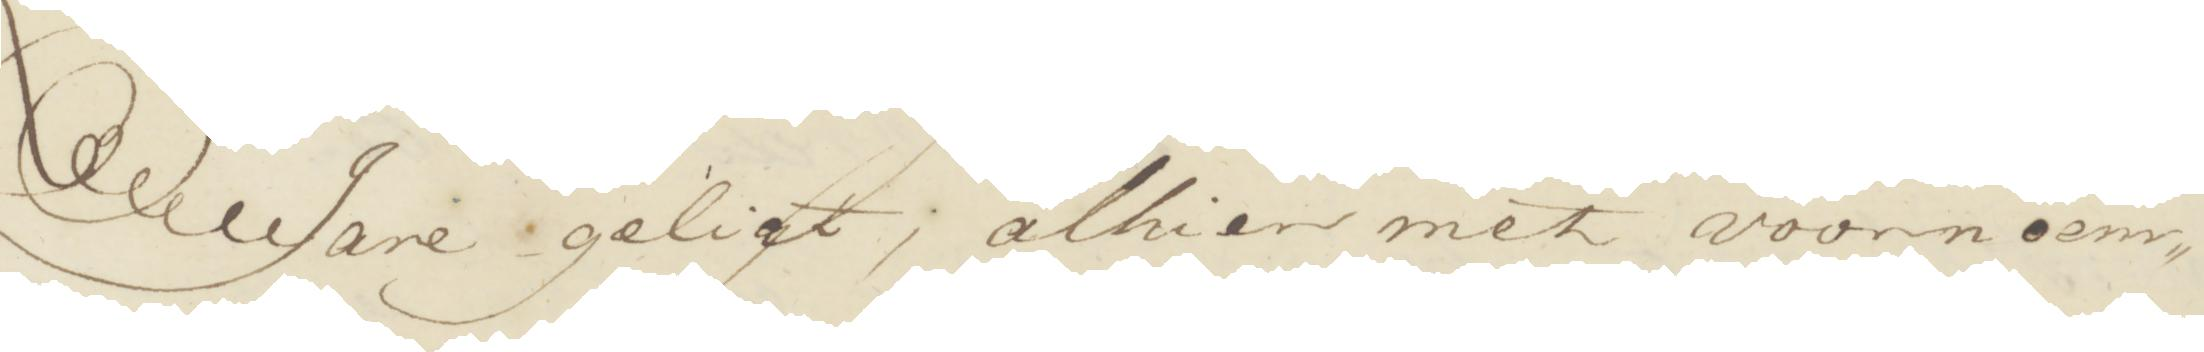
Jare geligt, alhier met voornoem„
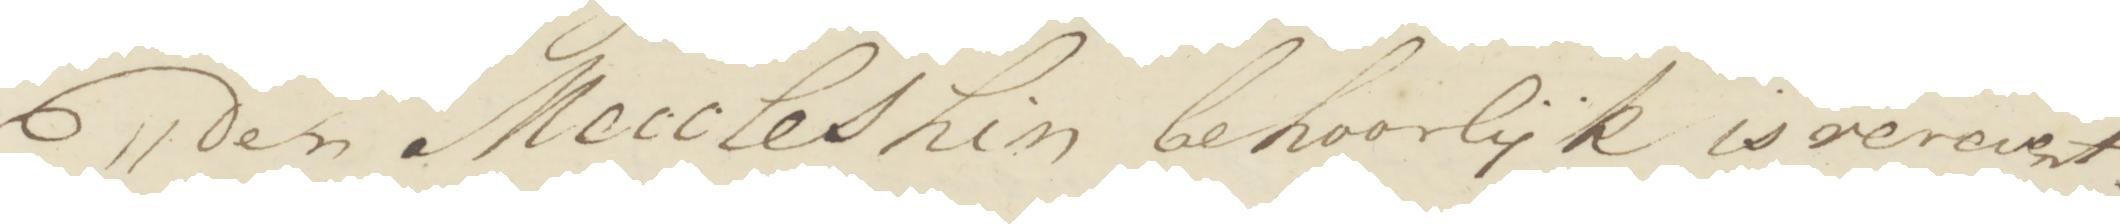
„den Meccleshin behoorlijk is verevent
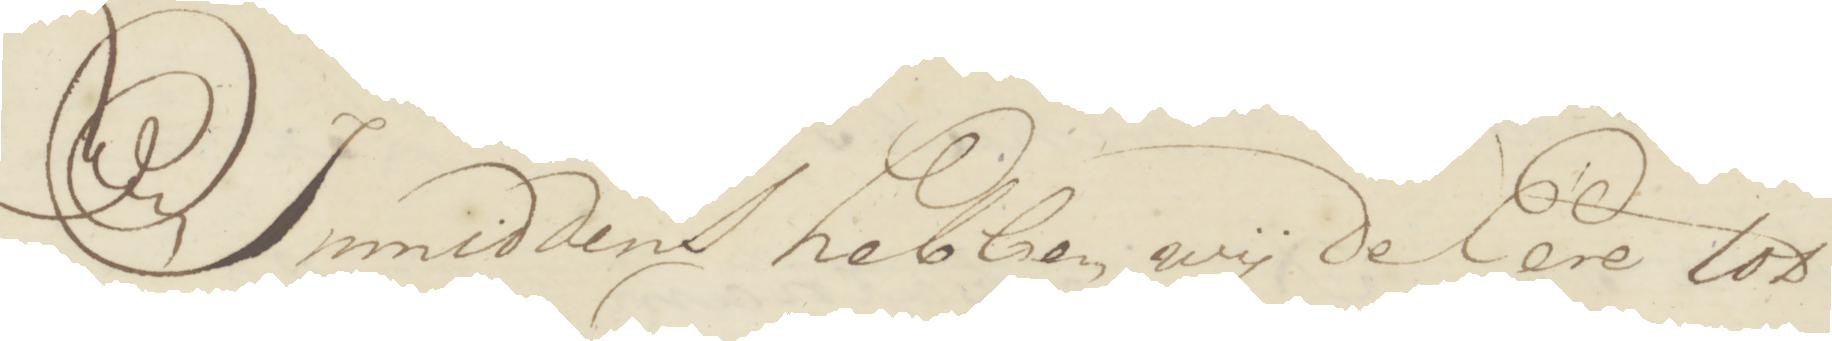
Inmiddens hebben wij de Eere tot
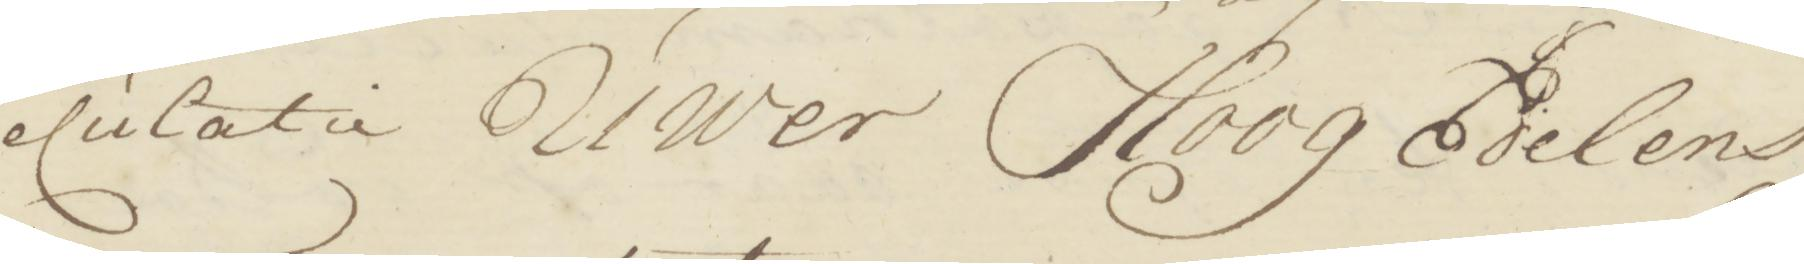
Speculatie Uwer Hoog Edelens
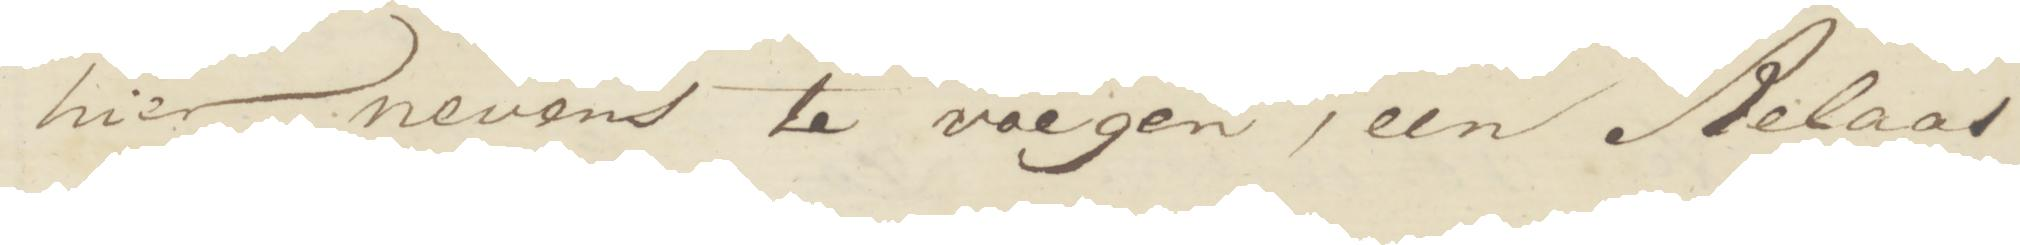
hier nevens te voegen, een Relaas
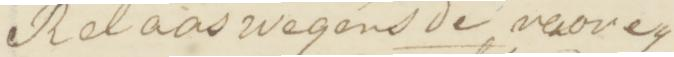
Relaas wegens de verove„
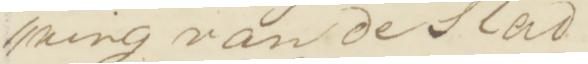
„ring van de stad
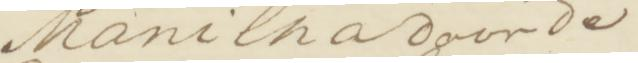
Manilna door de
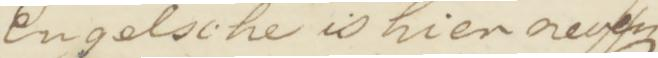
Engelsche is hier neven
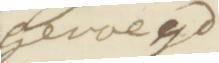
gevoegd
